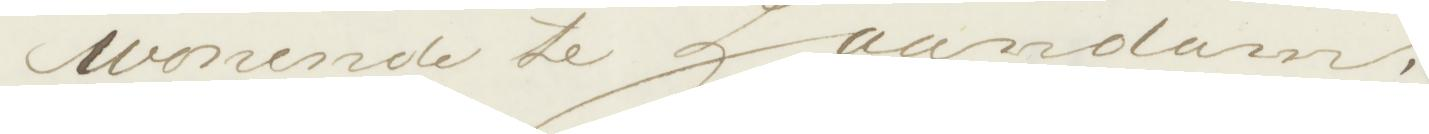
wonende te Zaandam,
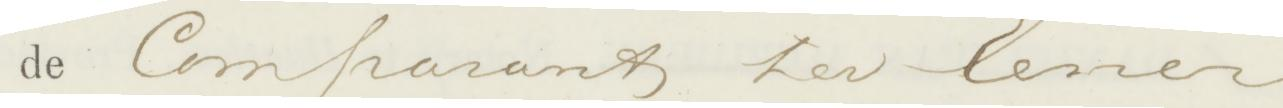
de Comparant ter Eener
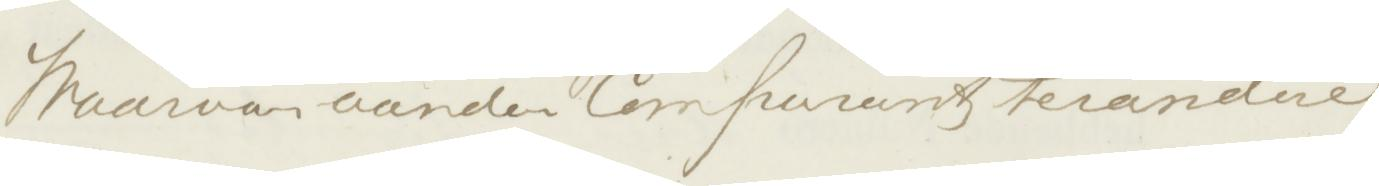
Waarvan aan den Comparant ter andere
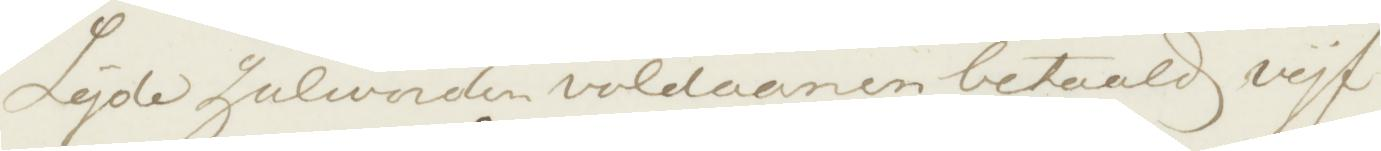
Zijde zal worden voldaanen betaald vijf
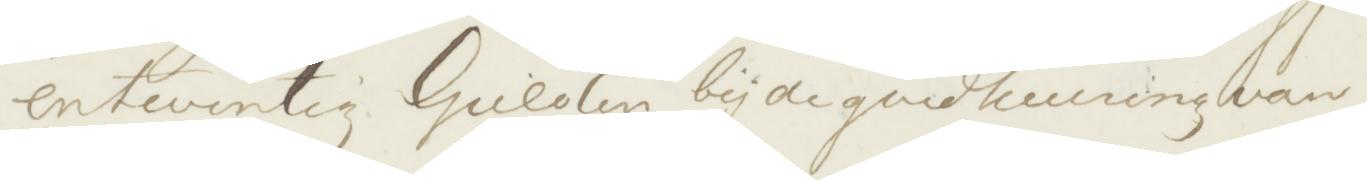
en twintig Gulden bij de goedkeuring van
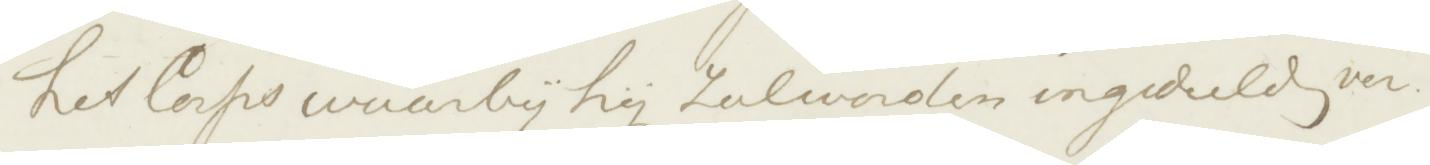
het Corps waarbij hij zal worden ingedeeld ver„
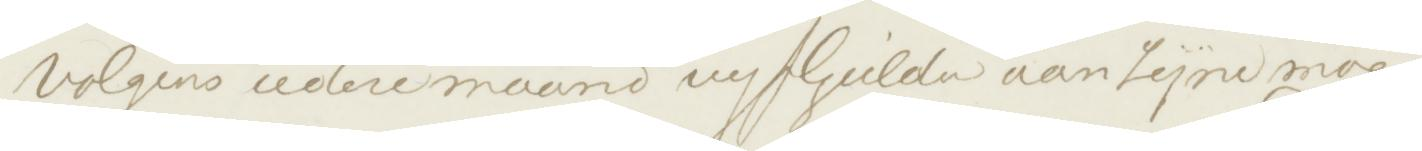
volgens iedere maand vijf Gulden aan Zijne moe.
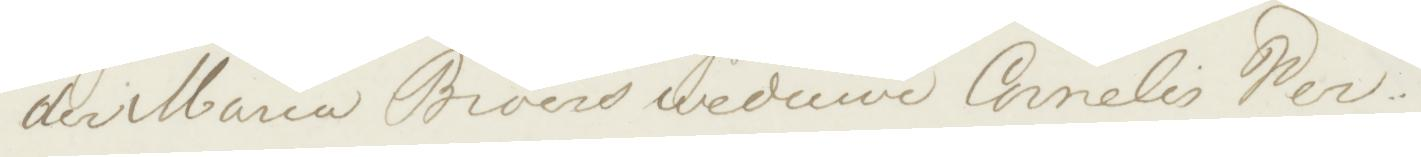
der Maria Broers weduwe Cornelis Ver„
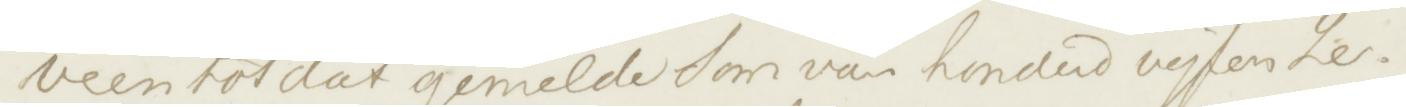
veen tot dat gemelde Som van honderd vijfen Ze„
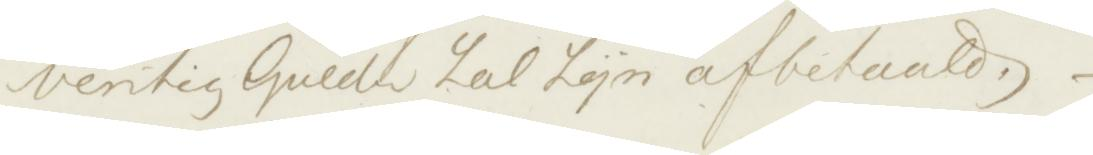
ventig Gulden Zal Zijn afbetaald
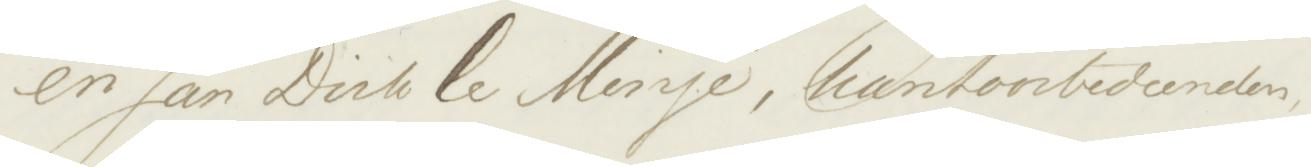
en Jan Dirk le Minje, kantoorbedienden,
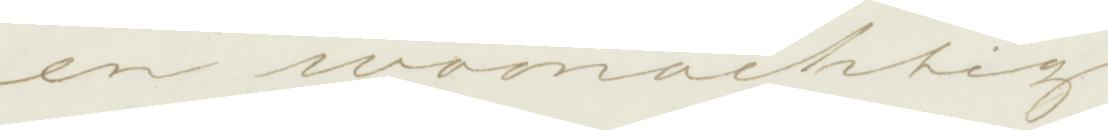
en woonachtig
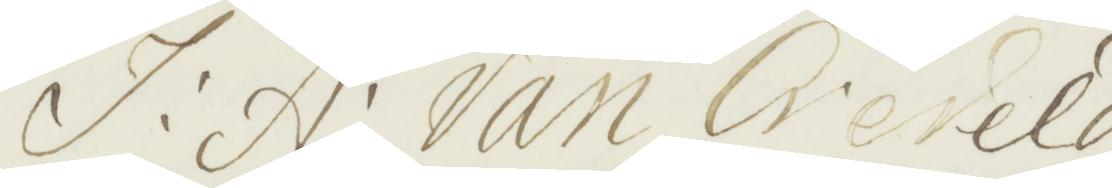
J: A van Creveld
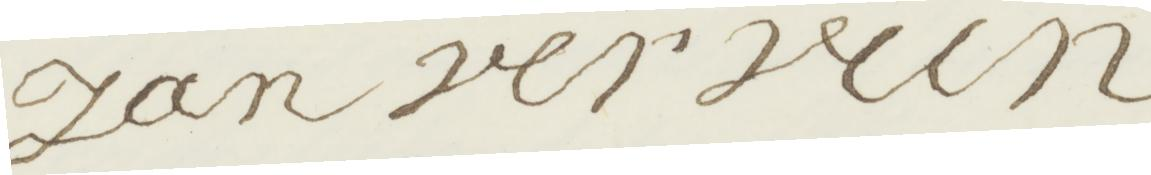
Jan ver veen
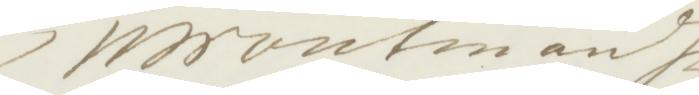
W Woutman Jr
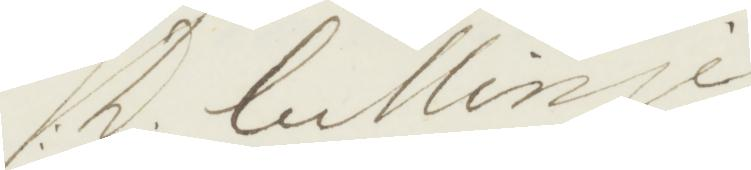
V: D. Luttinje
